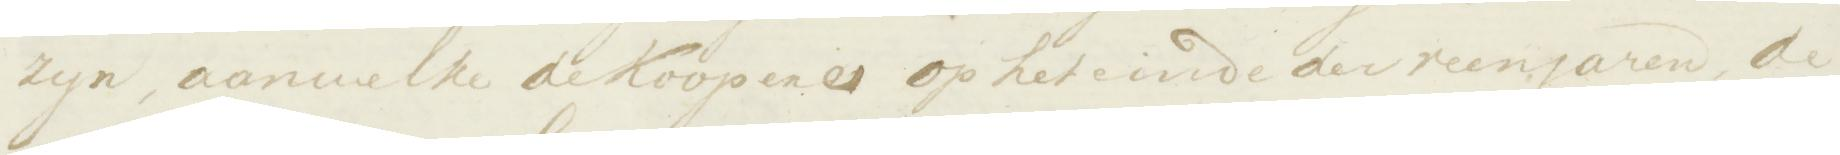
zyn, aanwelke de koopers op het einde der veenjaren, de
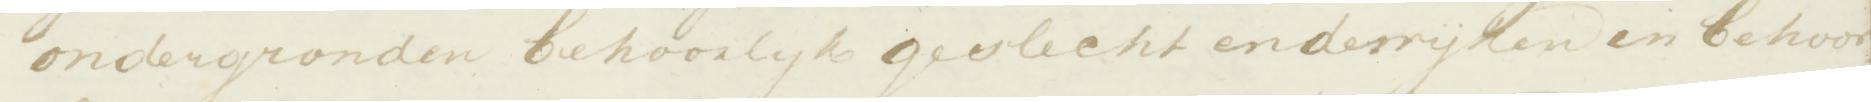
ondergronden, behoorlyk geslecht en de wijken in behoor
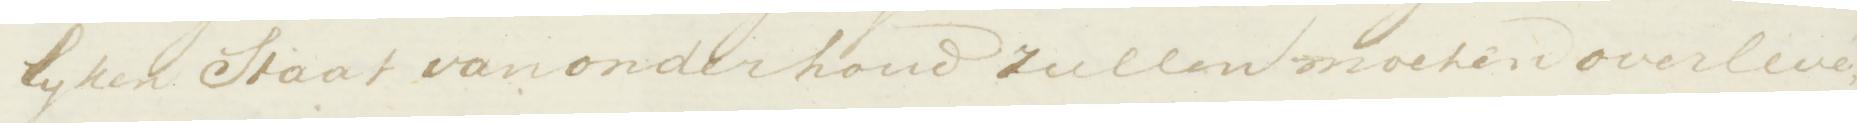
lyken staat van onderhoud zullen moeten overleve,
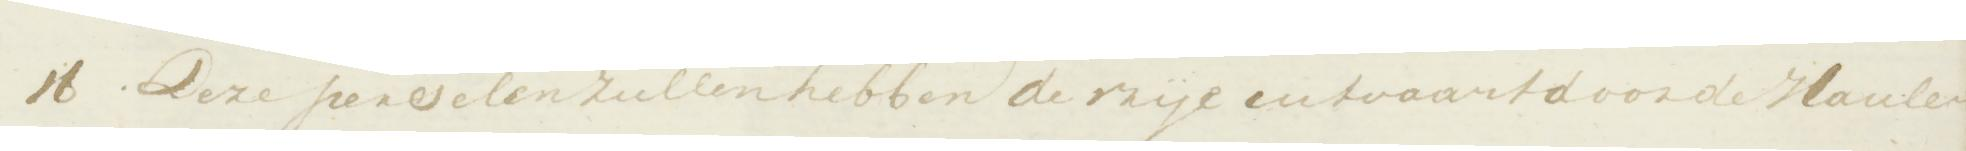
16. Deze perselen zullen hebben de vrije uitvaart door de Hauler
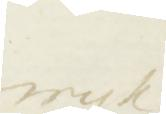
wyk
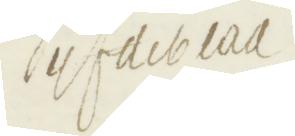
Vyfdeblad
